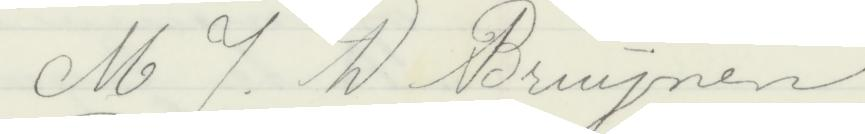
M J. D Bruijnen
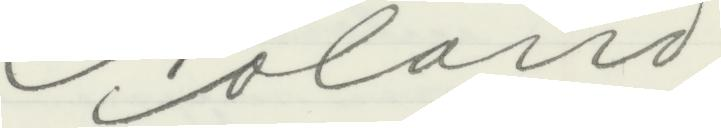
CPoland
